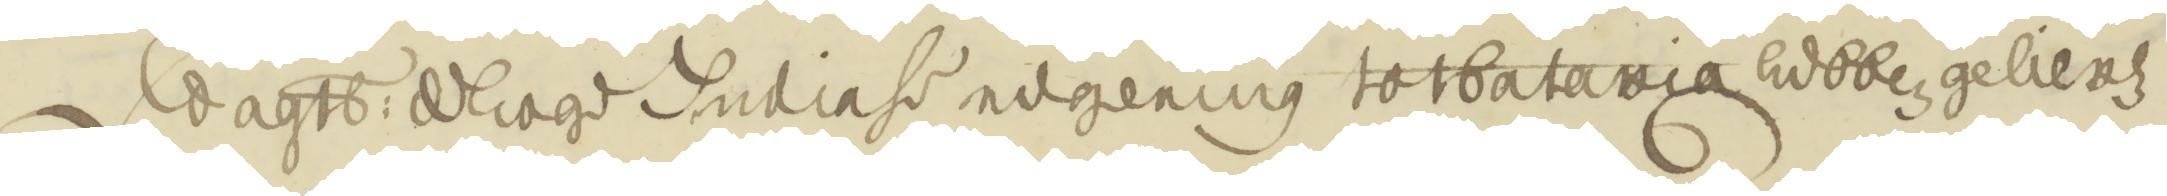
Ed agtb: de hoge Indiase regering tot batavia hebben gelieven
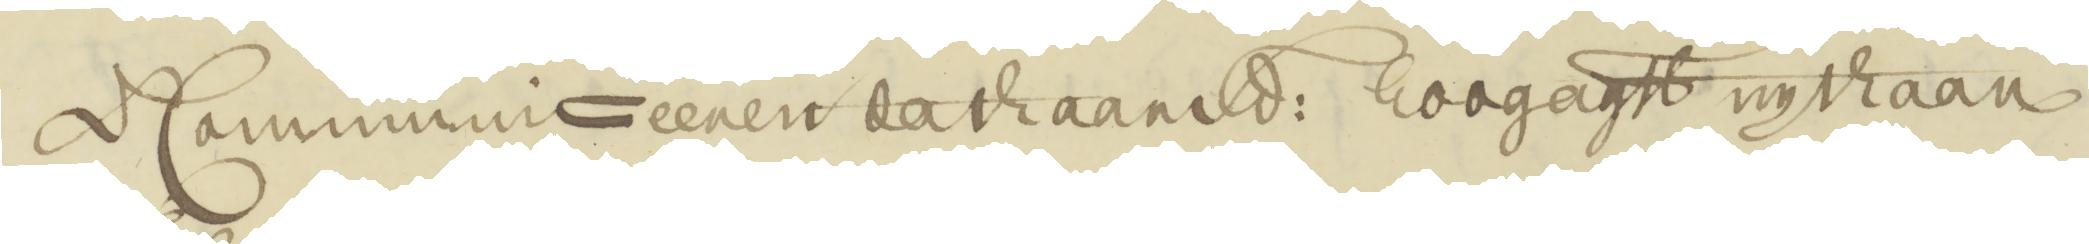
te Communiceeren dat haar Ed: hoogagtb uyt haar
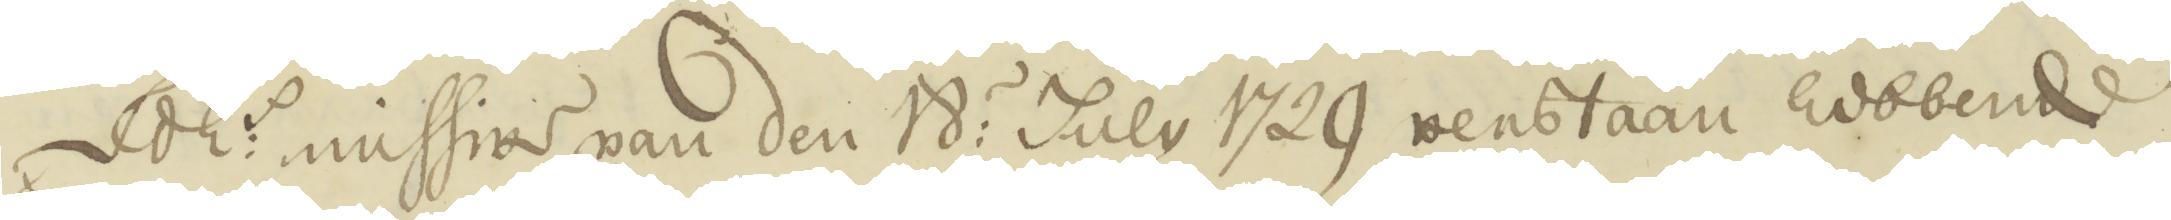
Edh:s missive van den 18:e Iuly 1729 verstaan hebbende
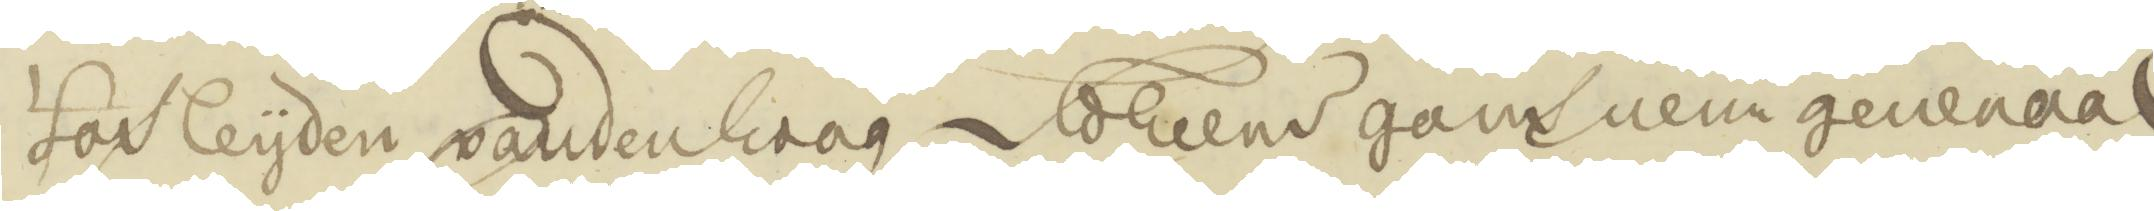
't overleijden van den hoog Ed heere gouverneur generaal
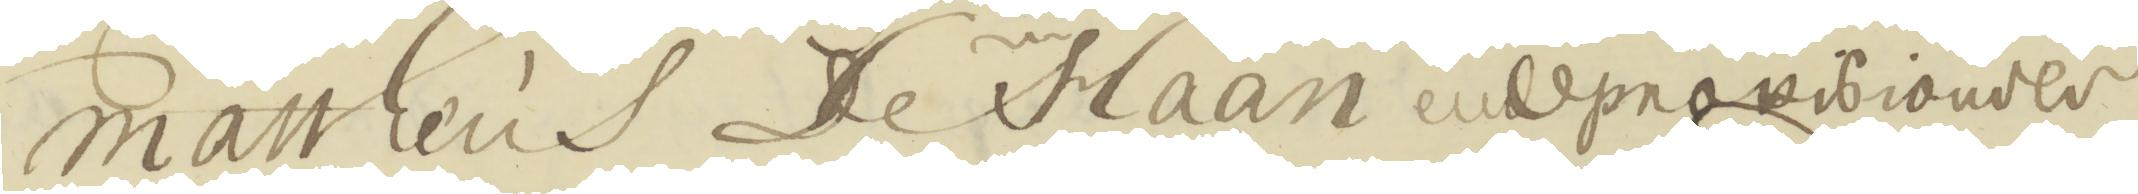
mattheus De Haan ende provisionele
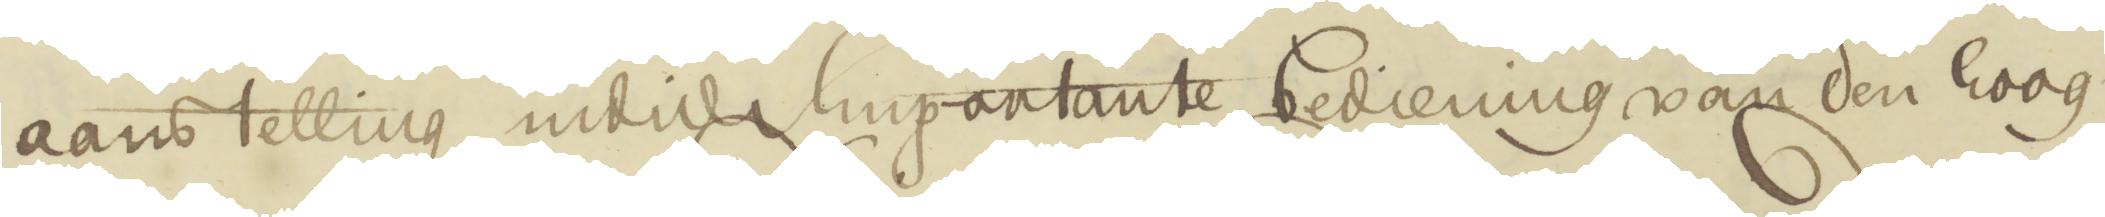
aanstelling indie Emportante bediening van den hoog
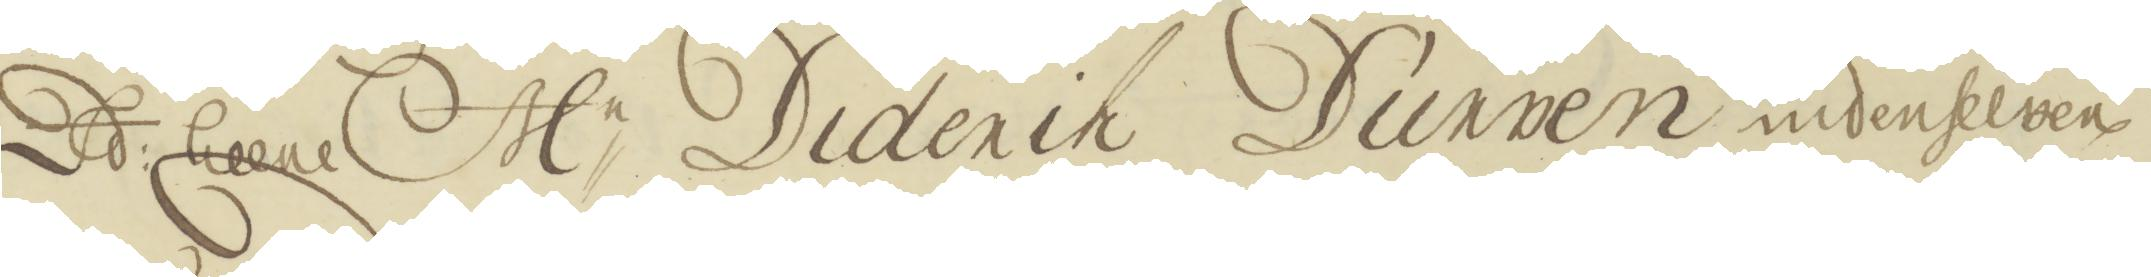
Ed: heere M„r Diderik Durven inder selver
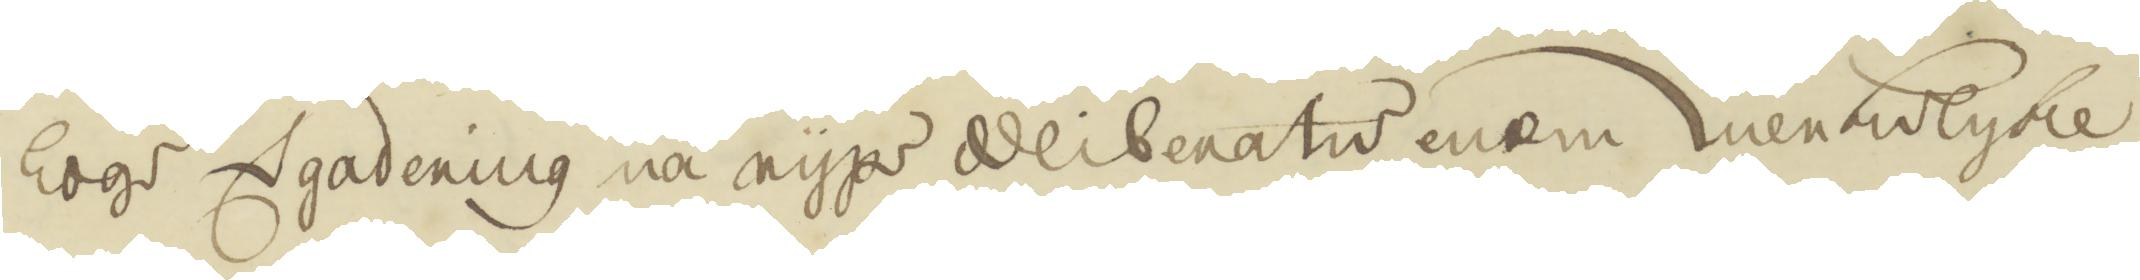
hoge vergadering na rijpe deliberatie en om merkelyke
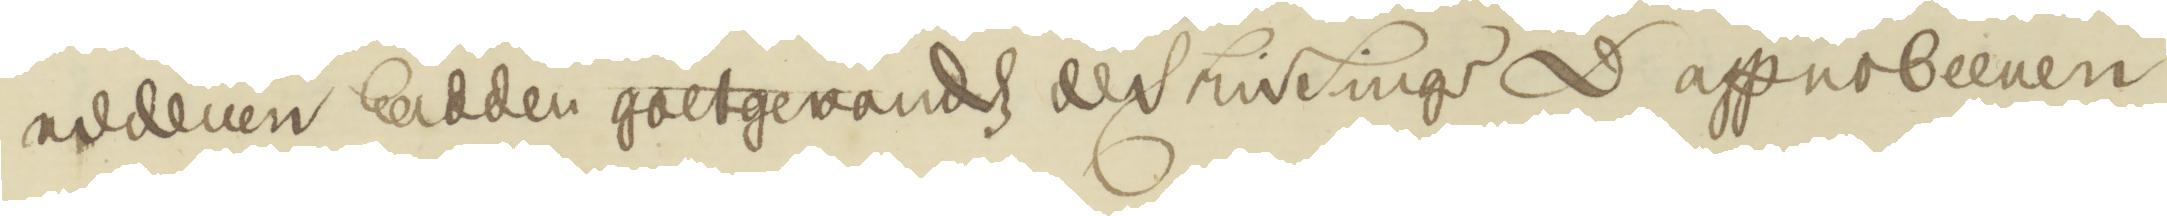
redenen hadden goetgevonden de verkiesinge te approbeeren
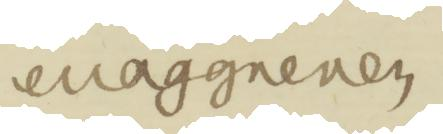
en aggreren
